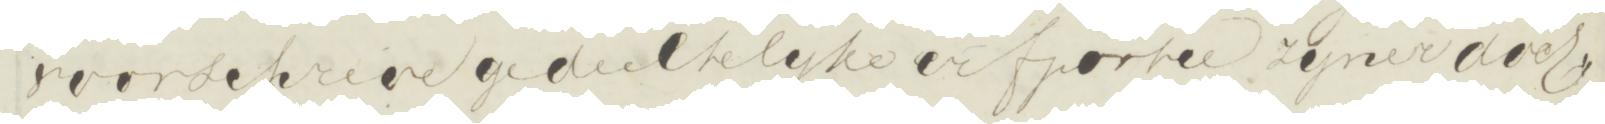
voorschreve gedeeltelyke erfportie zyner doch„
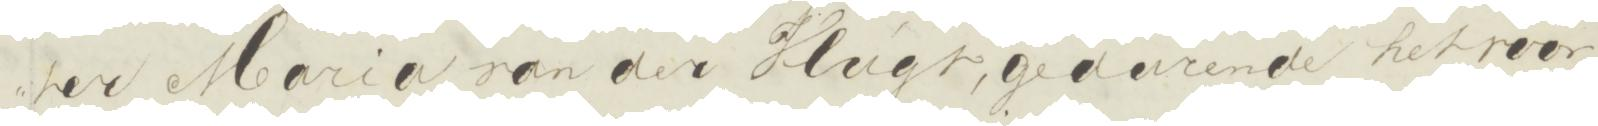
„ter Maria van der Vlugt, gedurende het voor
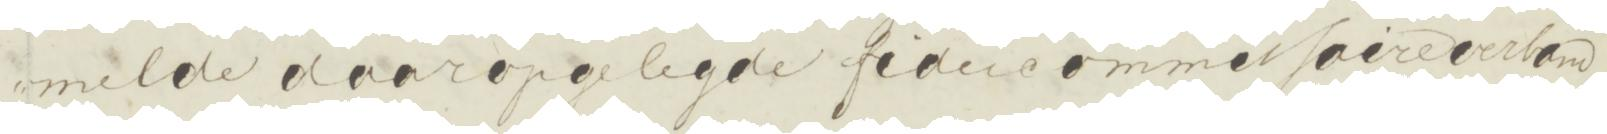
„melde daaropgelegde fideicommissaire verband
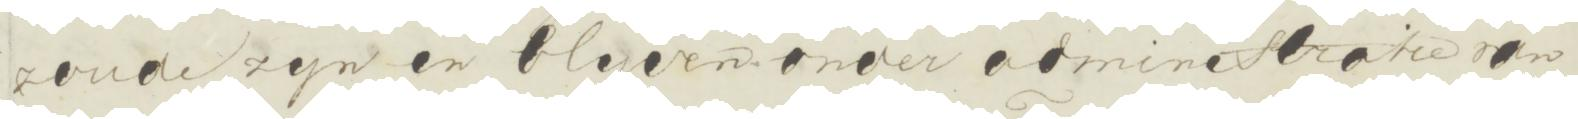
zoude zyn en blyven onder administratie van
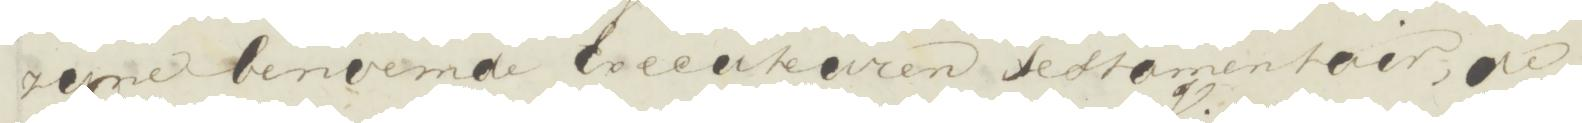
zyne benoemde Executeuren Testamentair, de
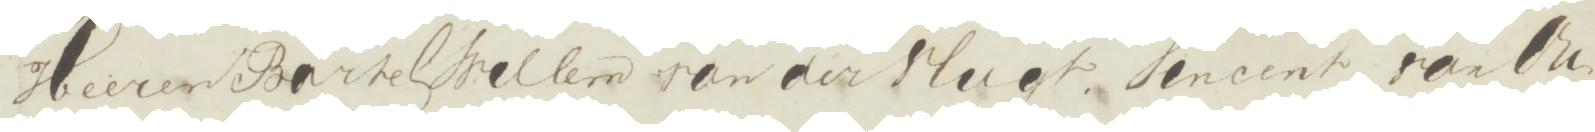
Heeren Bartel Willem van der Vlugt„ Vincent van Ou
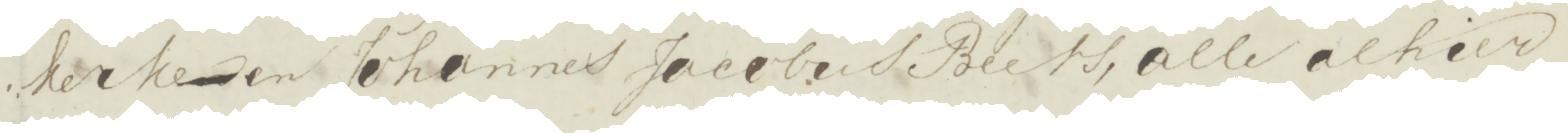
„kerke en Johannes Jacobus Beets, alle alhier
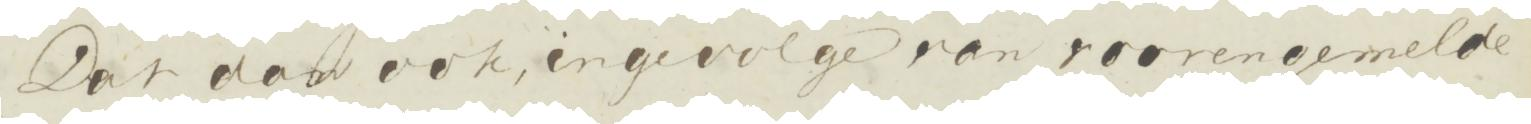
Dat dan ook, ingevolge van voorengemelde
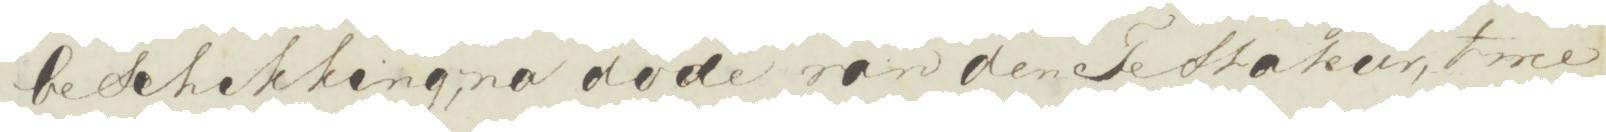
beschikking, na dode van den Testateur, twee
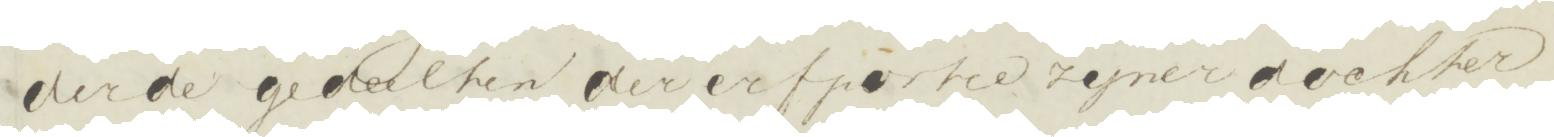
derde gedeelten der erfportie zyner dochter
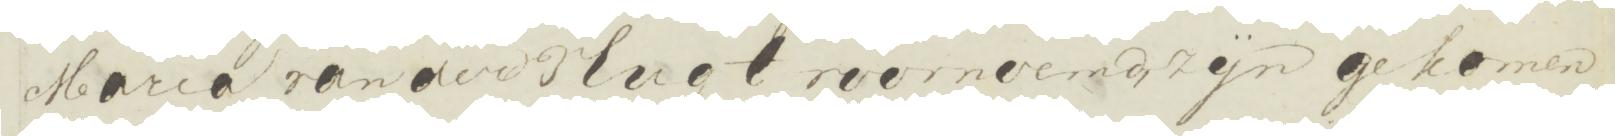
Maria van der Vlugt voornoemd zijn gekomen
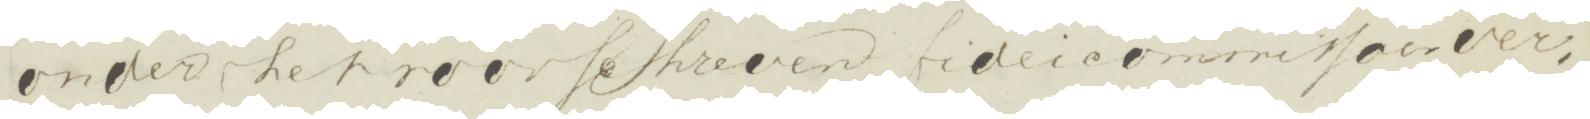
onder, het voorschreven fideicommissair ver,
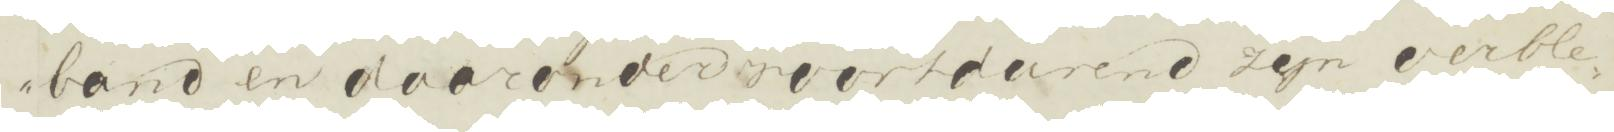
„band en daaronder voortdurend zyn verble„
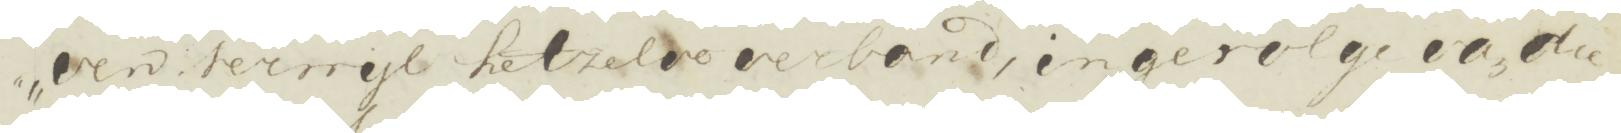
„„ven; terwijl hetzelve verband, ingevolge van die
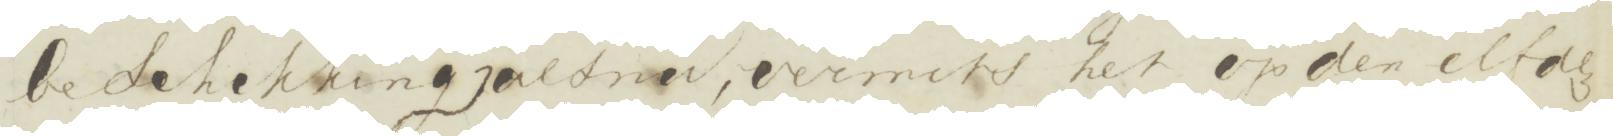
beschikking alsnu, vermits het op den elfden
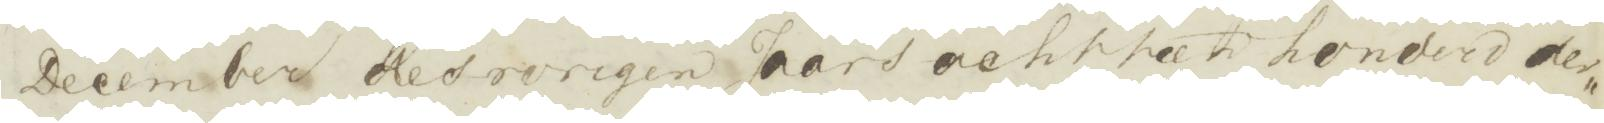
December des vorigen Jaars achttien honderd der„
